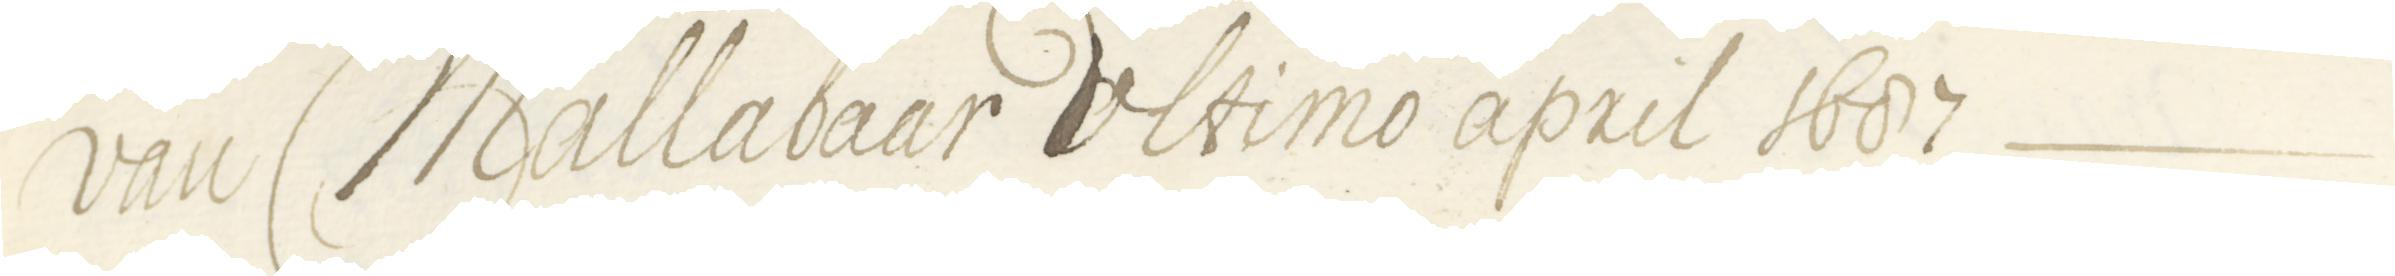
van Mallabaar Ultimo april 1687 —
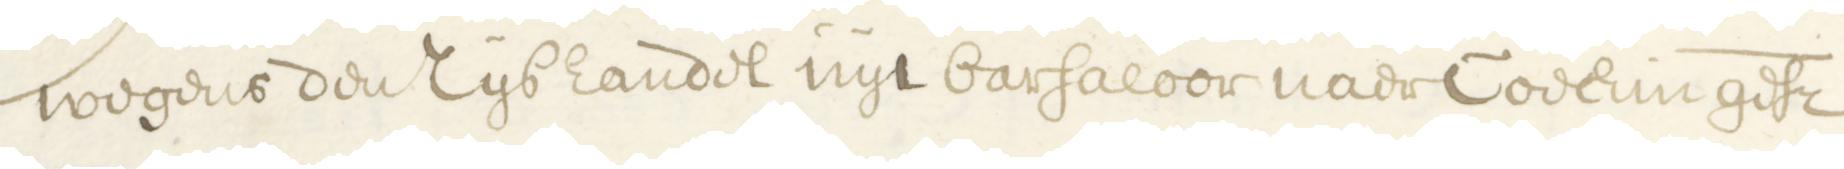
wegens den rijs handel uijt barsaloor naer Coechin gesr
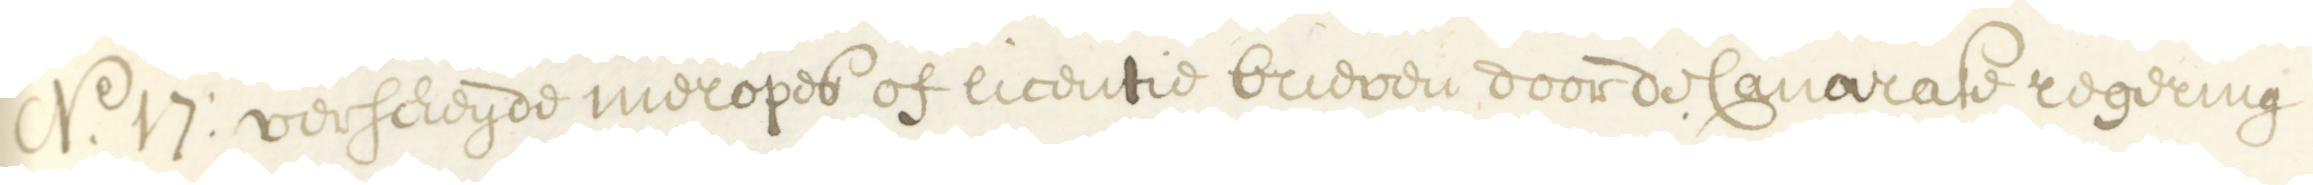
N. 17: verscheijde nieropes of licentie brieven door de Canarate regering
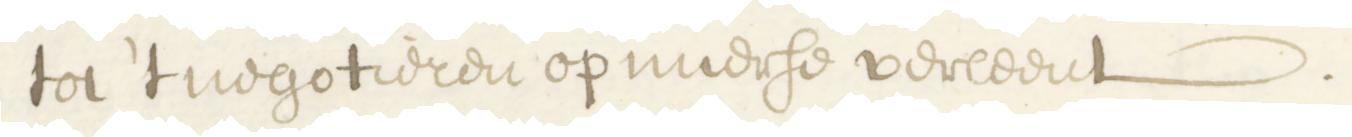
tot ’t negotieren op mierse verleent.
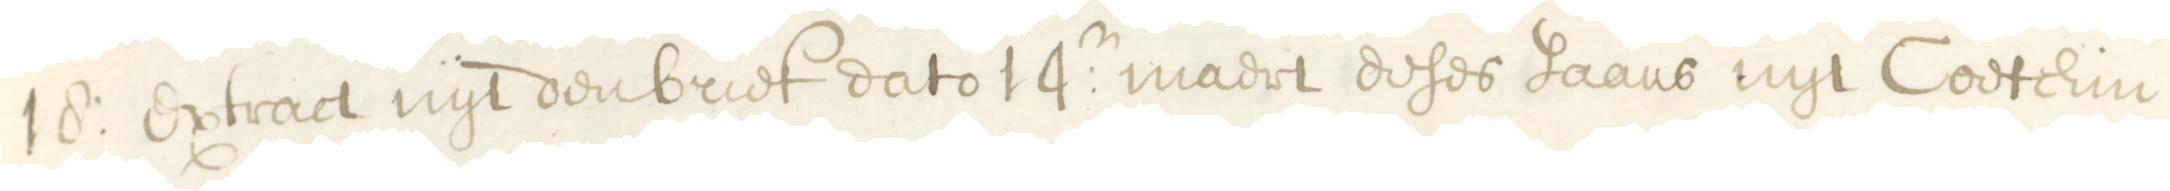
18: Extract uijt den brief dato 14:en maert deses Jaars uijt Coetchin
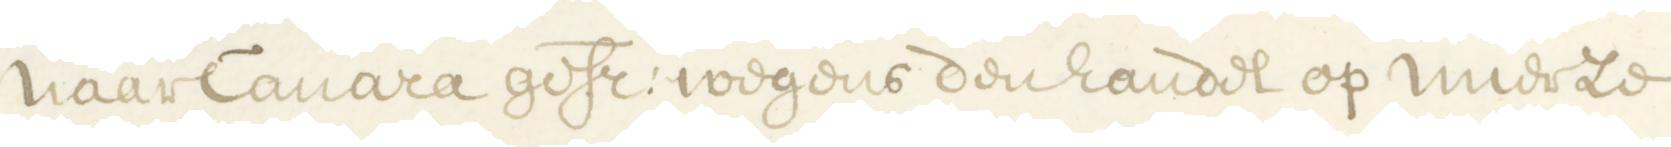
naar Canara gesr: wegens den handel op mierze
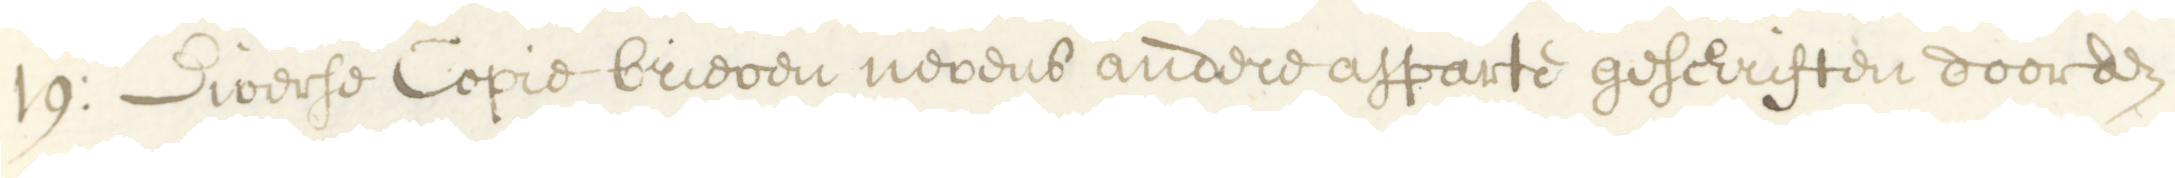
19: Diverse Copie brieven nevens andere apparte geschriften door den
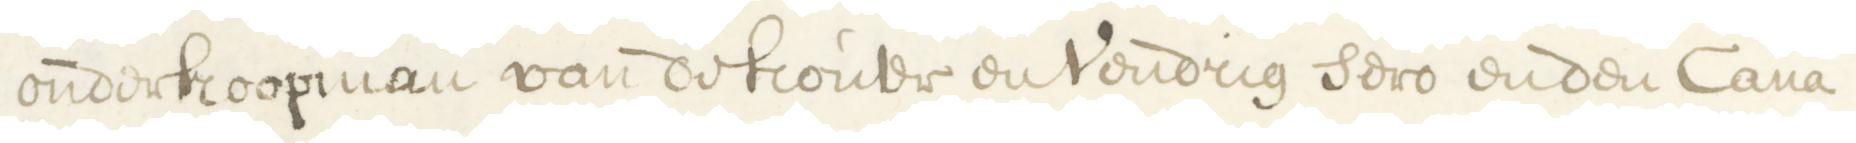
onderkoopman van dekouter en Vendrig sero en den Cana
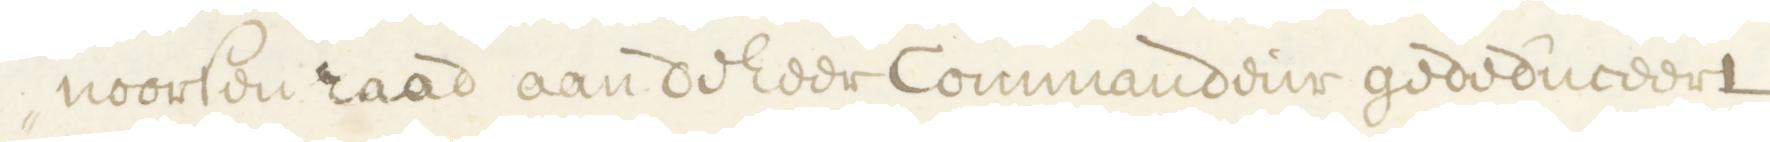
„noorsen raad aan deheer Commandeur gededuceert
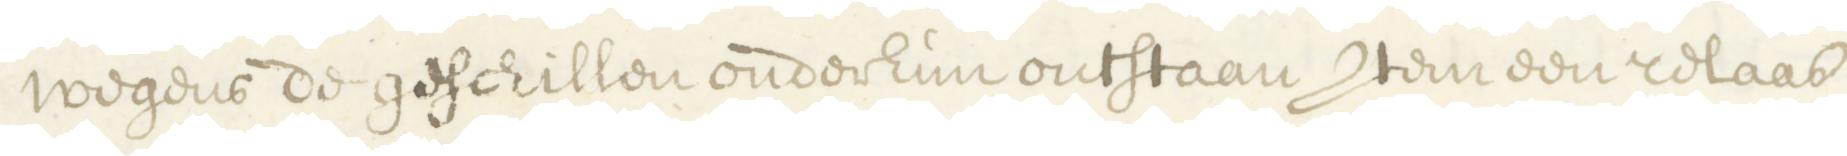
wegens de geschillen onderhun ontstaan Jtem een relaas
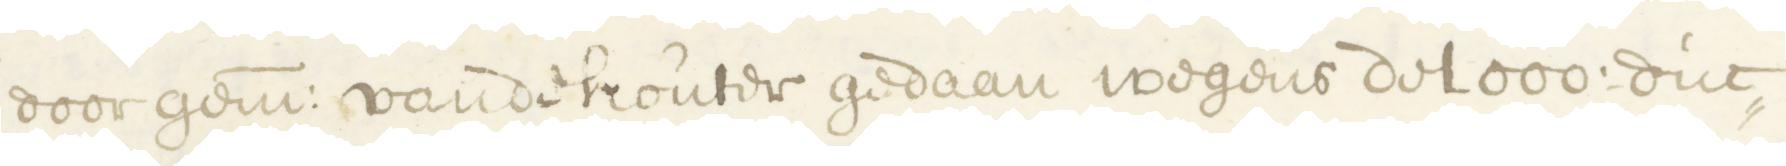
door gem: van dekouter gedaan wegens de 1000: duc„
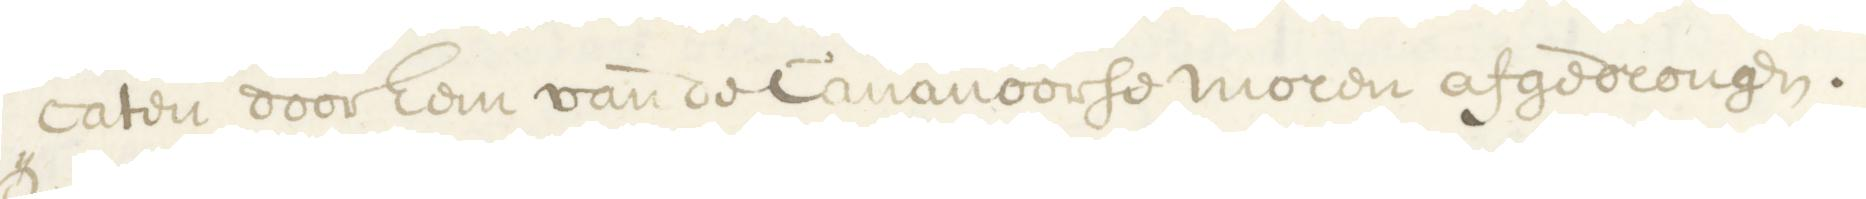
caten door hem van deCananoorse moren afgedrongen.
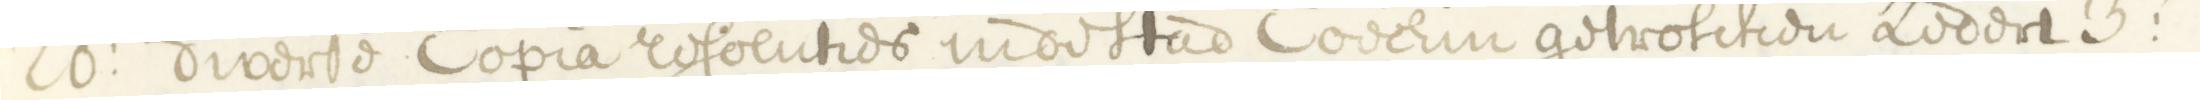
20: diverse Copia resoluties indestad Coechin getrokken zedert 3:en
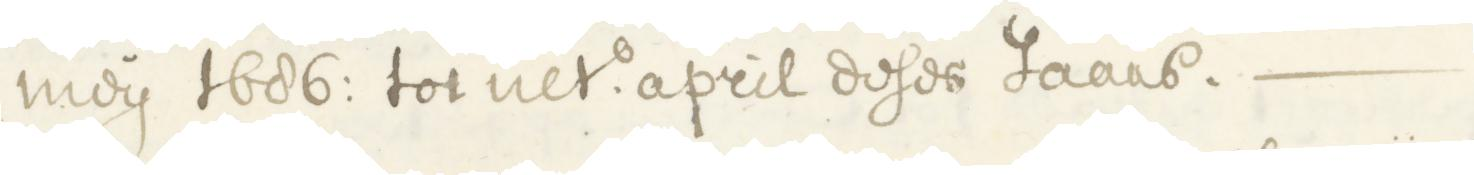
meij 1686: tot ult:o april deses Iaars. —
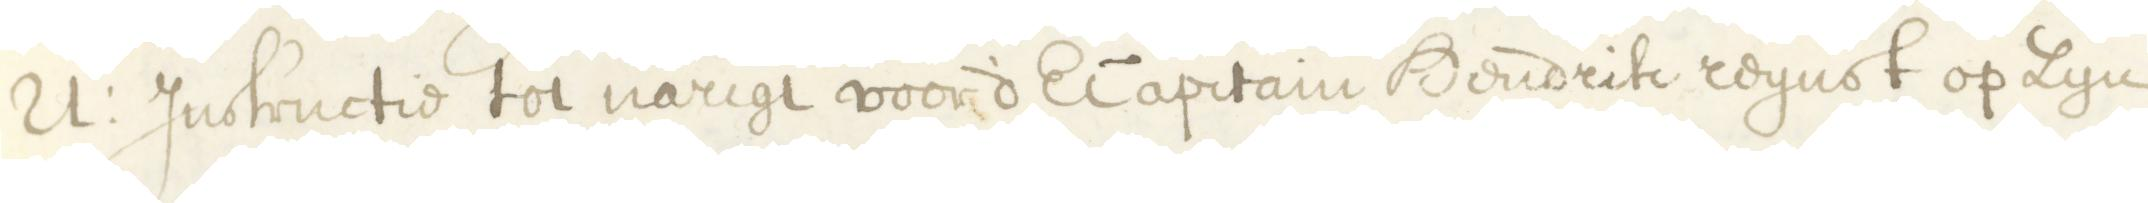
21: Instructie tot narigt voor d’ ECapitain Hendrik reijnst op zijn
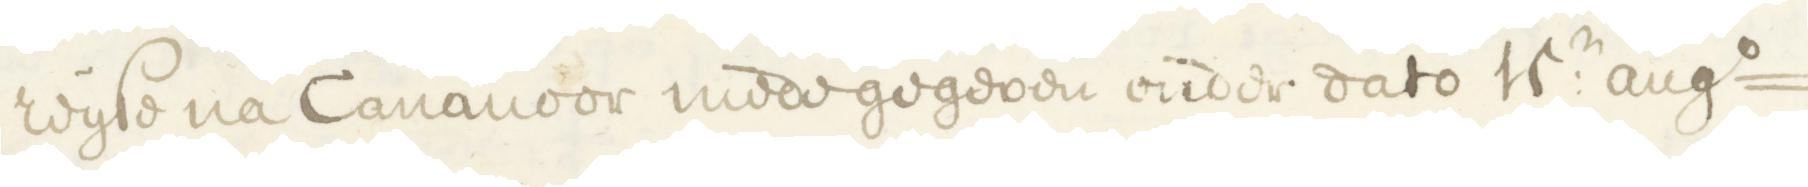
reijse na Cananoor mede gegeven onder dato 15:' aug=o
